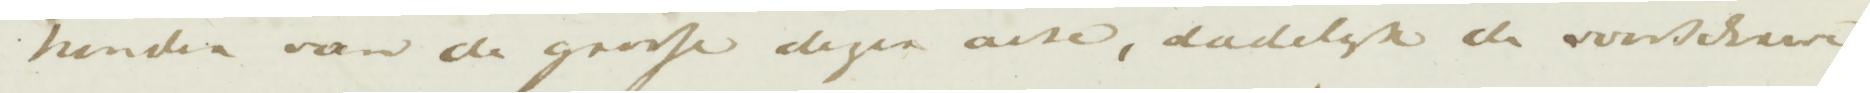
houder van de grosse dezer acte, dadelyk de voorschreve
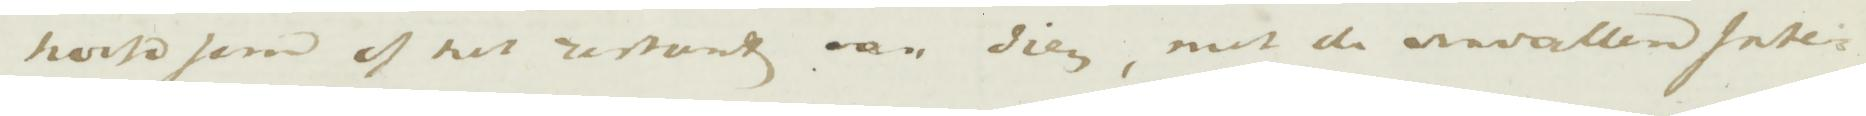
hoofdsom of het restant van dien, met de vervallen Jnte„
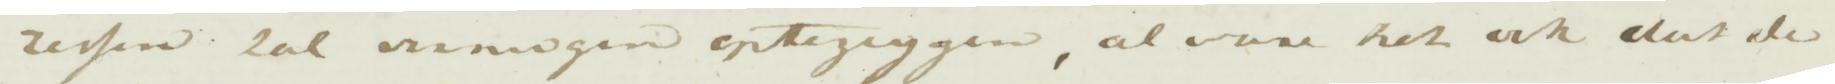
ressen zal vermogen optezeggen, al van het ook dat de
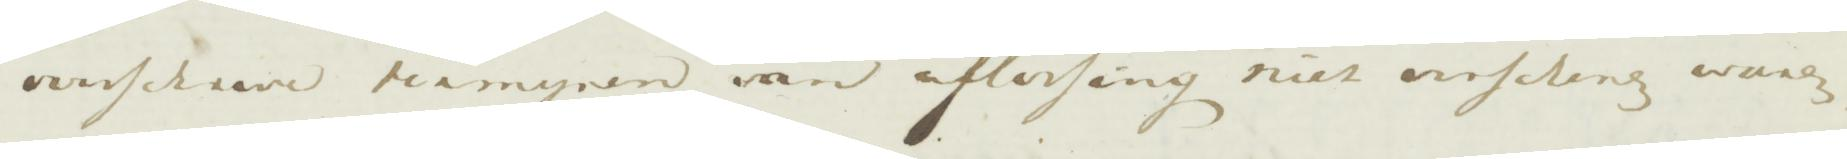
voorschreve termynen van aflossing niet verschenen waren
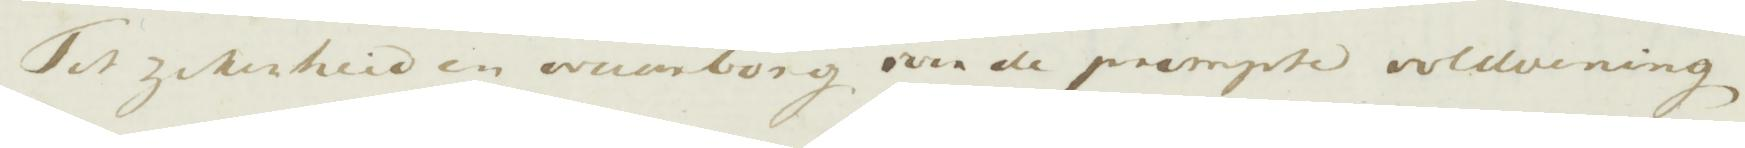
Tot zekerheid in waarborg over de prompte voldoening
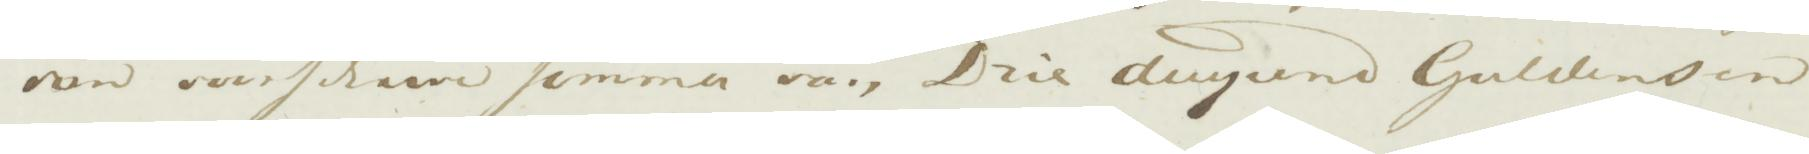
van voorschreve somma van Drie duizend Guldens en
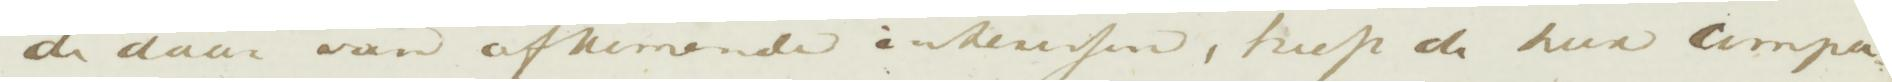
de daar van afkomende interessen, heeft de hier compa„
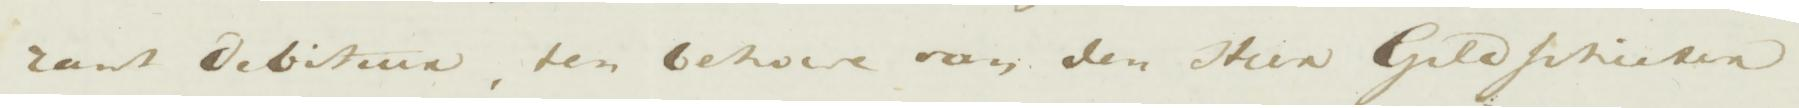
rant debiteur, ten behoeve van den Heer Geldschieter
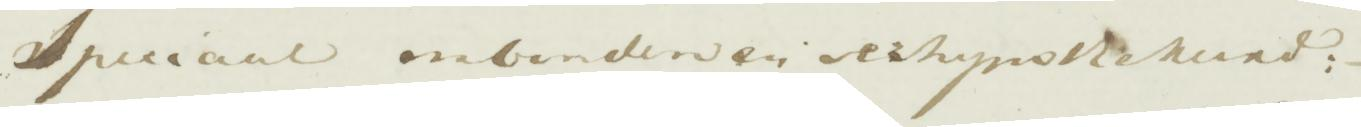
Speciaal verbonden en verhypothekeerd:
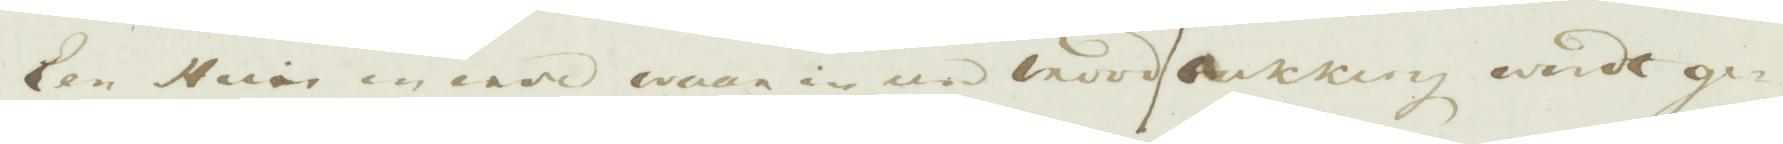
Een Huis en erve waar in een brood¶bakkery wordt ge„
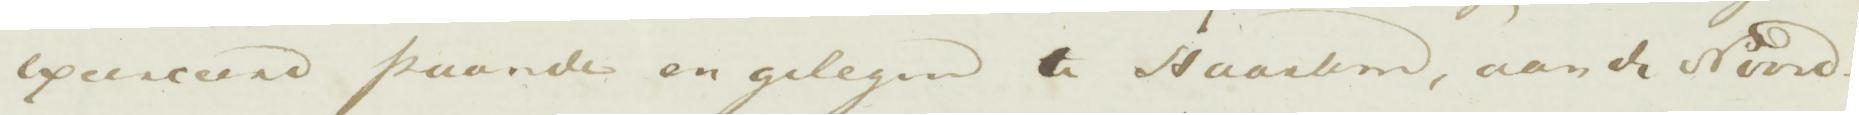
excerceerd staande en gelegen te Haarlem, aan de Noord=
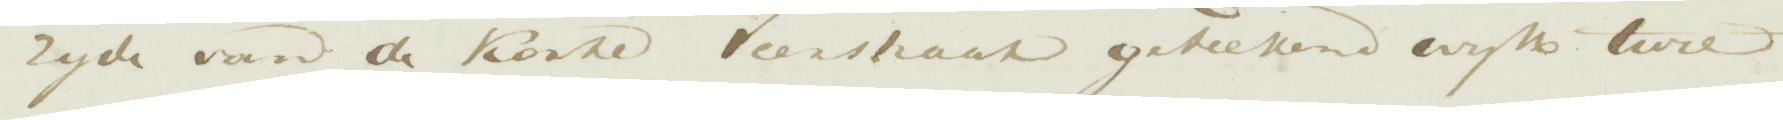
zyde van de Korte Veerstraat geteekend wyk twee
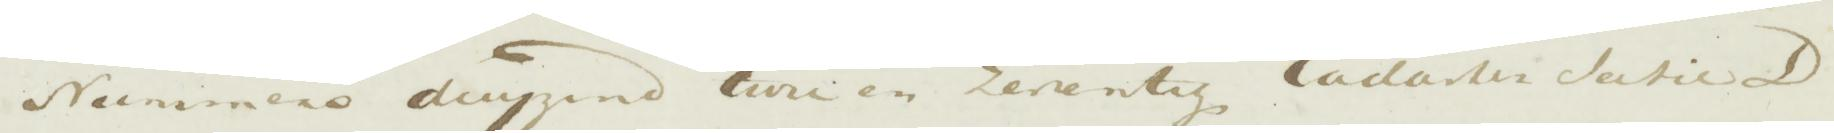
Nummero duyzend twee en zeventig Cadasterisatie D
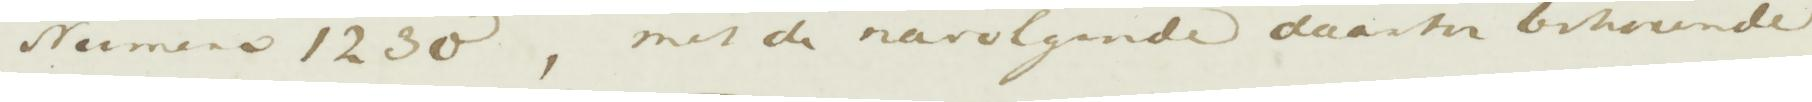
Numero 1230, met de navolgende daartoe behorende
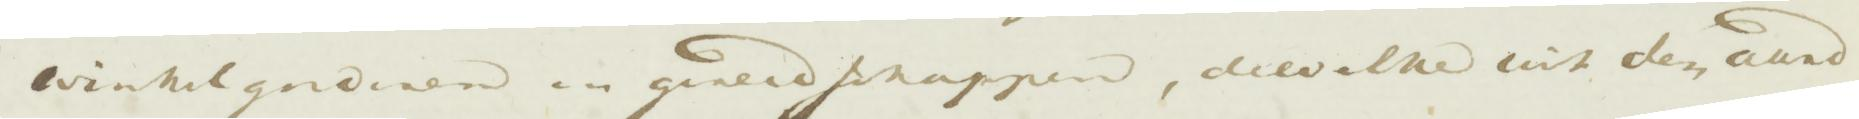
winkel goederen en gereedschappen, dewelke uit den aard
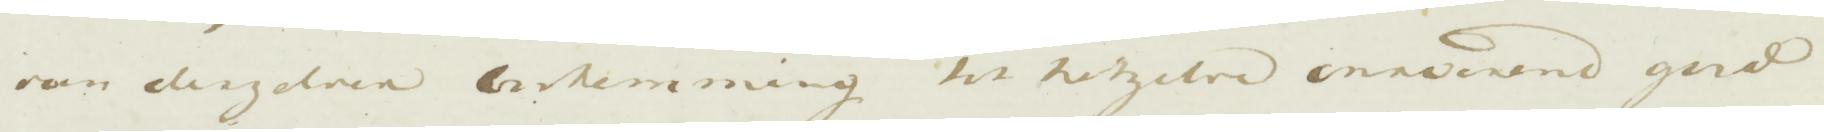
van derzelven bestemming tot hetzelve onroerend goed
